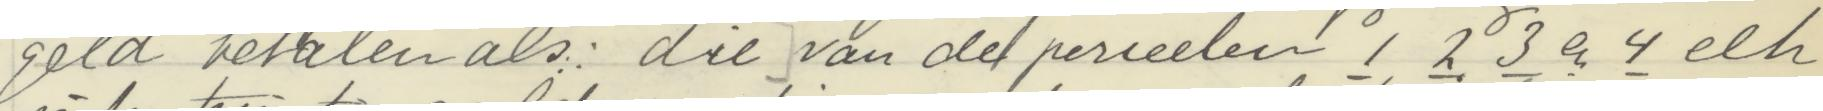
geld betalen als: die van de perceelen 1, 2, 3 a 4 elk
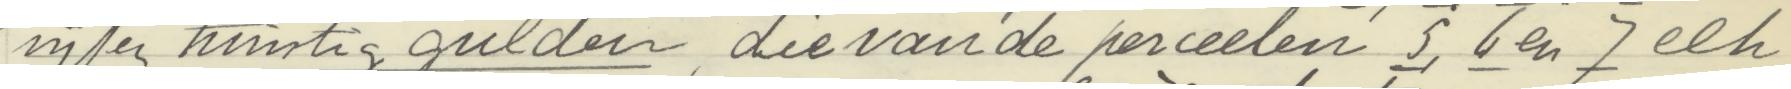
vijf en twintig gulden, die van de perceelen 5, 6 en 7 elk
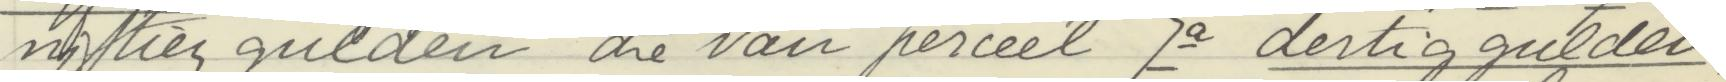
vijftien gulden, die van perceel 7-a dertig gulden
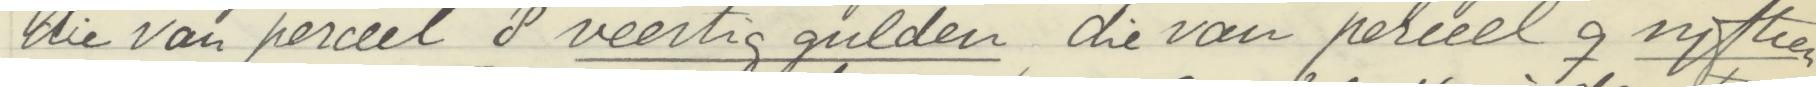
die van perceel 8 veertig gulden, die van perceel 9 vyftien
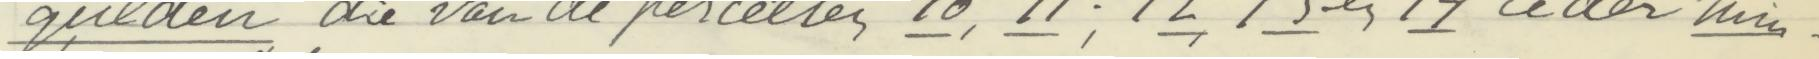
gulden die van de perceelen 10, 11, 12, 13 en 14 ieder twin
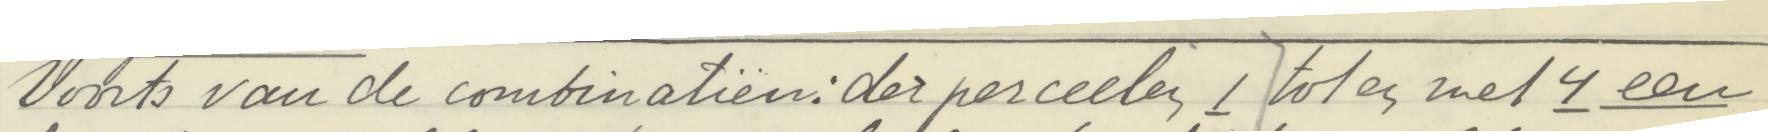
Voorts van de combinatiën der percelen 1 tot en met 4 een
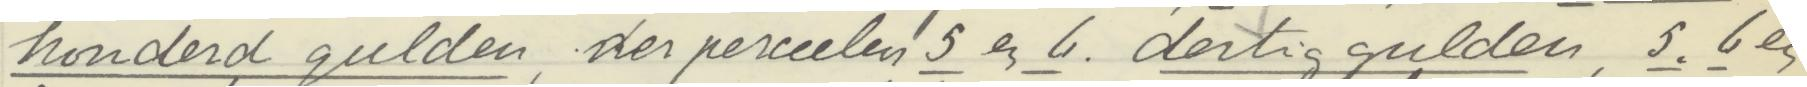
honderd gulden, de perceelen 5 en 6. dertig gulden, 5. 6 en
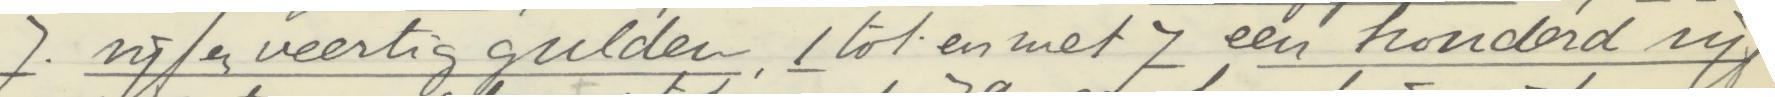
7. vijf en veertig gulden, 1 tot en met 7 een honderd vijf
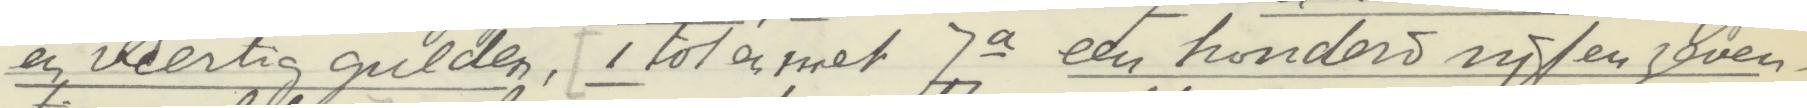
en veertig gulden, 1 tot en met 7-a een honderd vijf en zeven
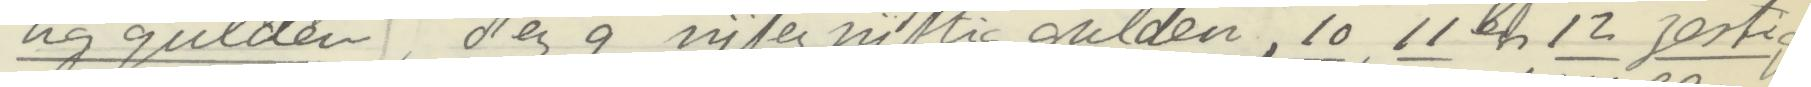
tig gulden, 8 en 9 vijfen vijftig gulden, 10, 11 en 12 zestig
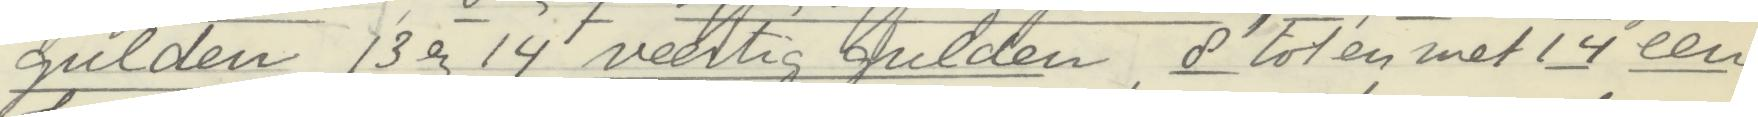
gulden, 13 en 14 veertig gulden, 8 tot en met 14 een
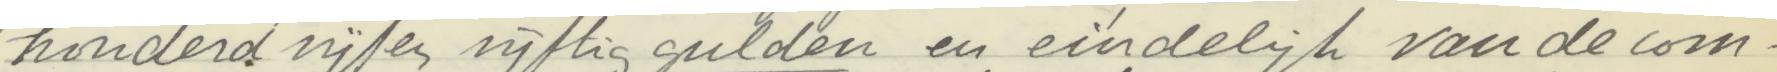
honderd vijf en vijftig gulden en eindelijk van de com
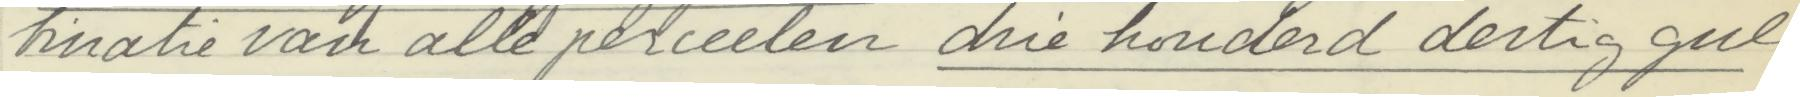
binatie van alle perceelen drie honderd dertig gul
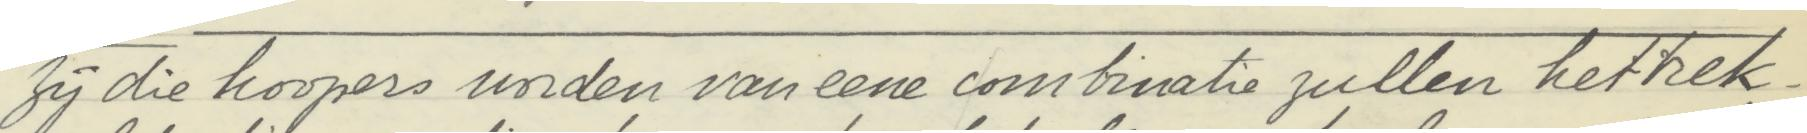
Zij die koopers worden van eene comtinatie gullen het trek-
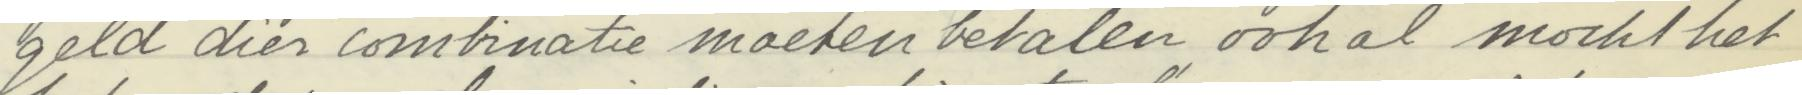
geld dier combinatie moeten betalen, ook al mocht het
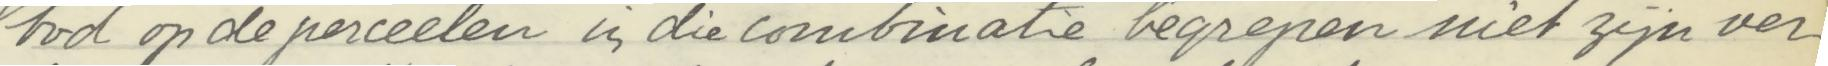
bod op de perceelen in die combinatie begrepen niet zijn ver
